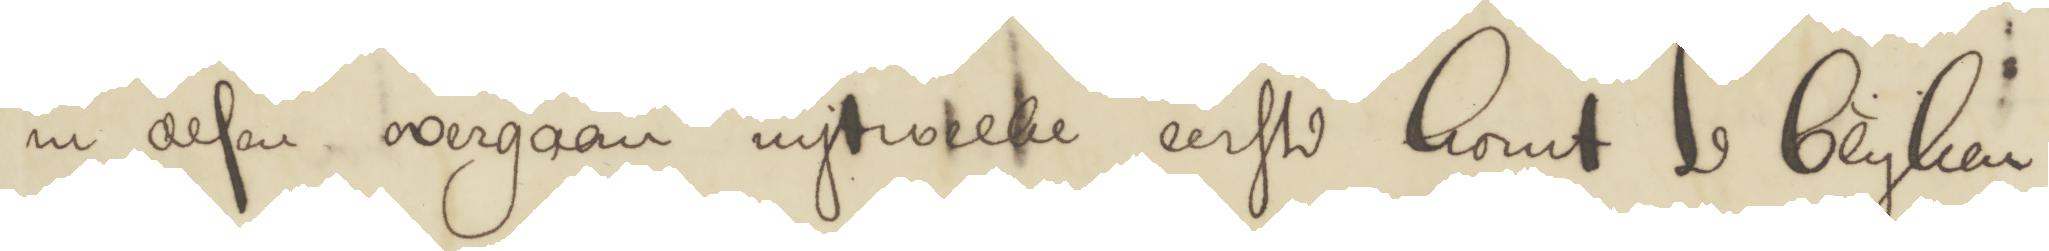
in desen overgaan uijtwelke eerste komt de blijken
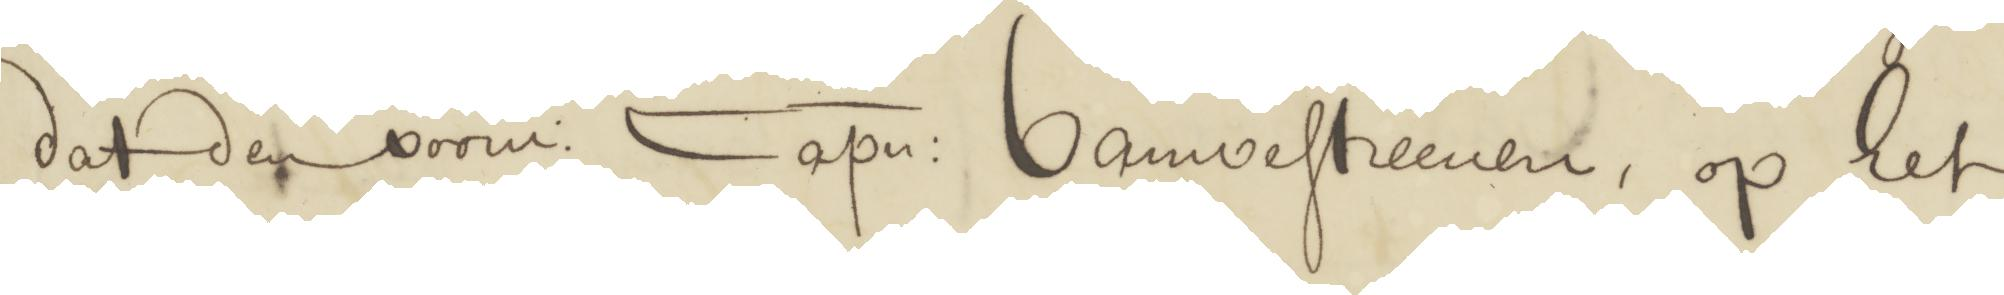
dat den voorn: Capn: van westreenen, op het
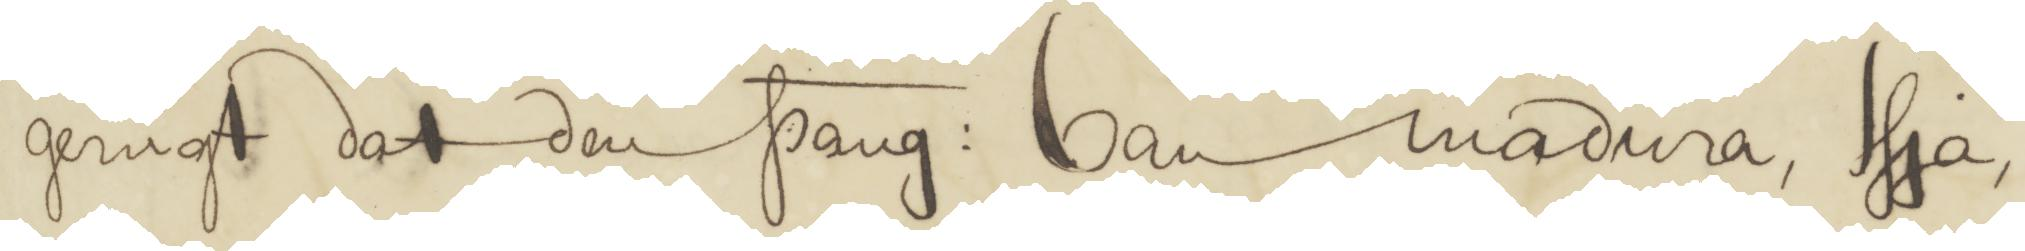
gerugt dat den pang: van madura, tsja,
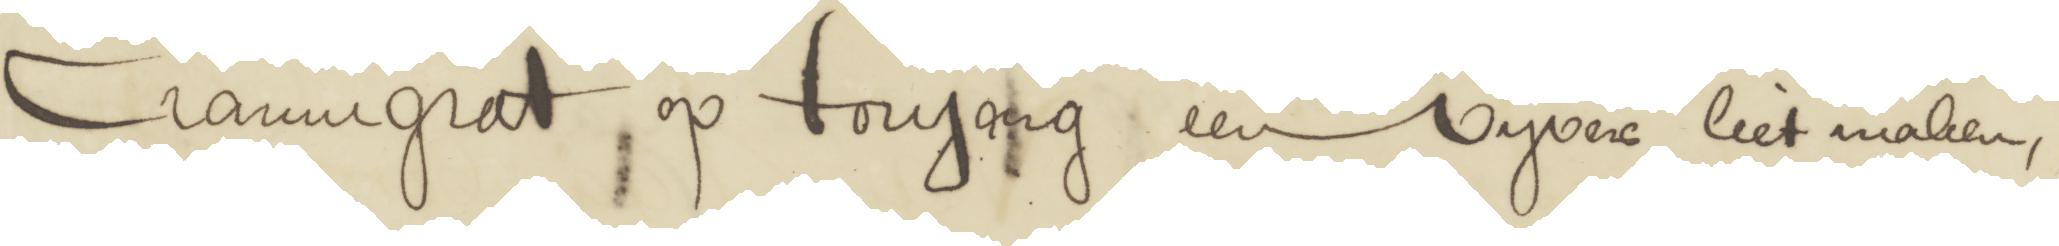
Craningrat op tonjong een vijver liet maken,
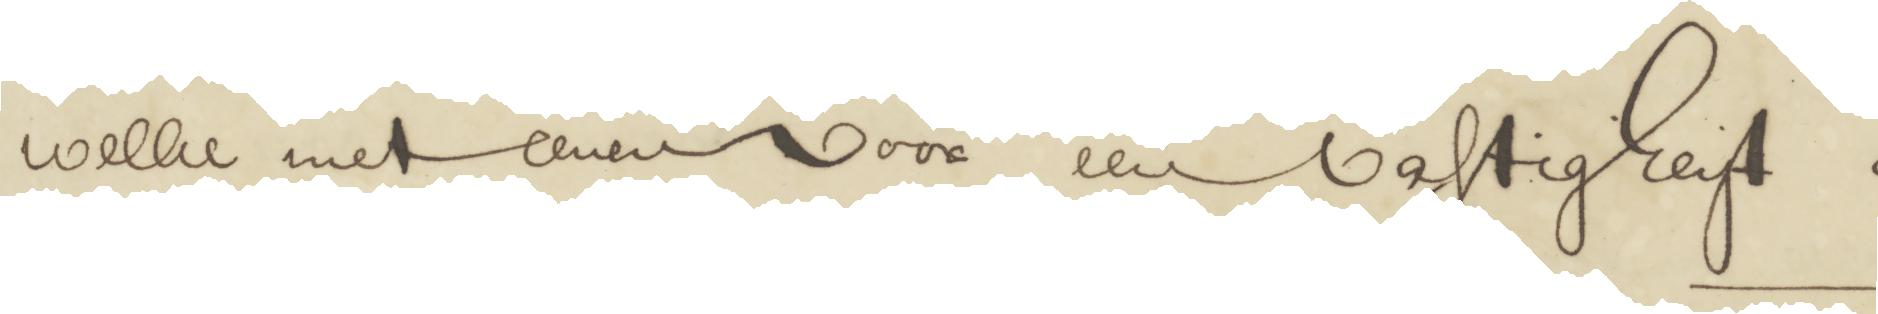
welke met eenen voor een vastigheijt
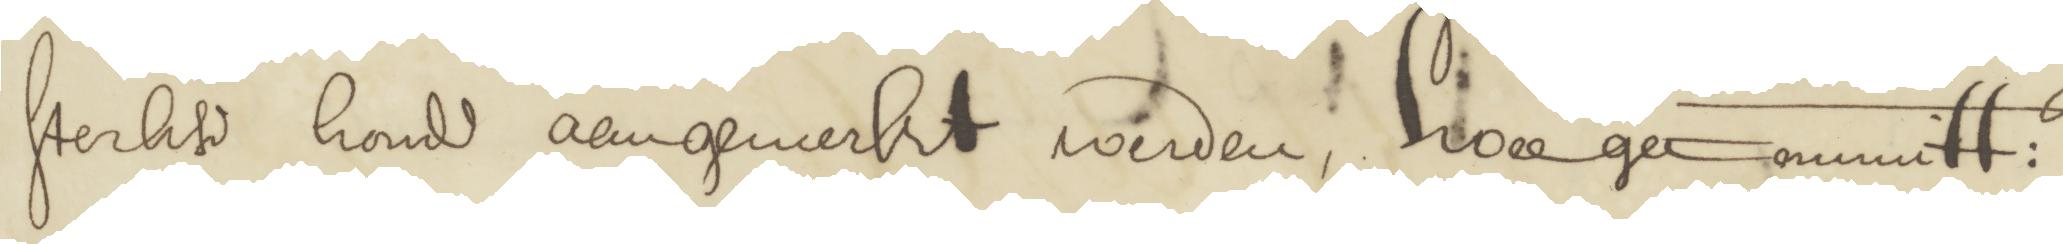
sterk te konde aangemerkt werden, twee gecommitt:s
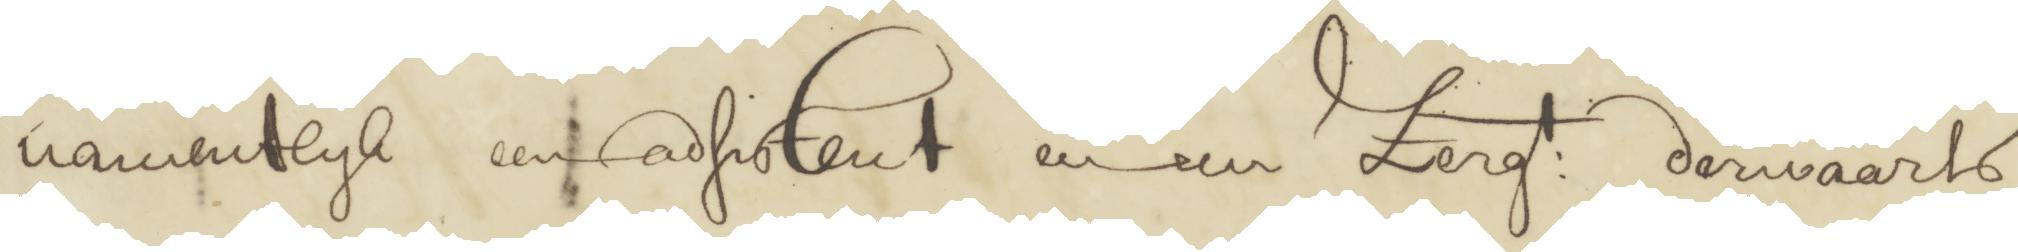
namentlijk een adsistent en een zerg:t derwaarts
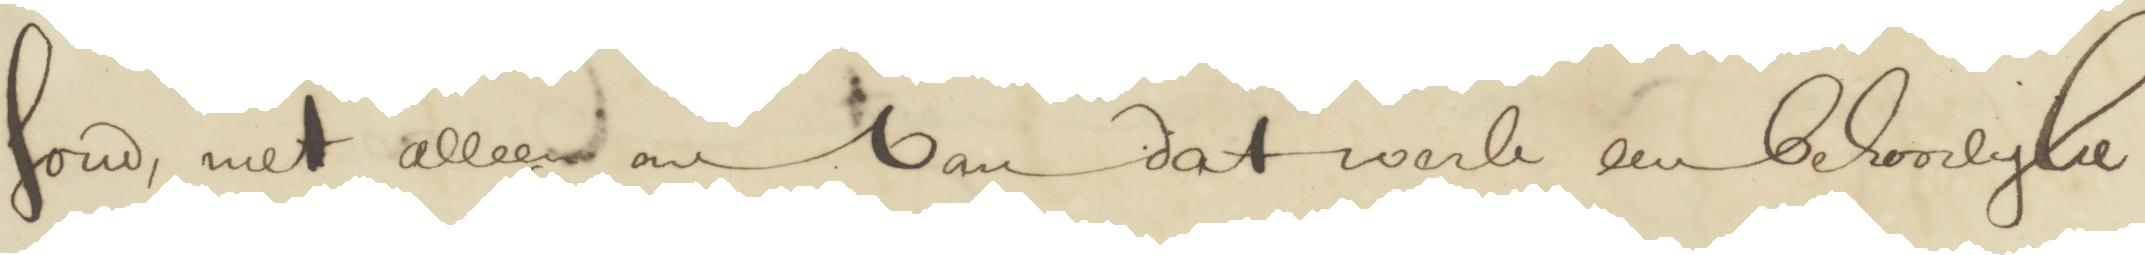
sond, niet alleen om van dat werk een behoorlijke
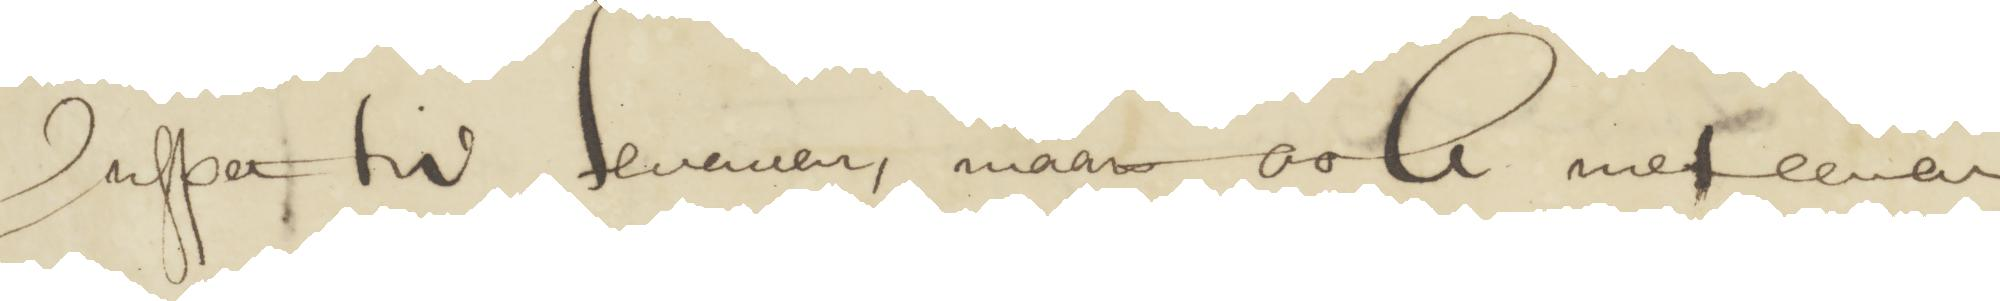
Jnspectie te nemen, maar ook met eenen
